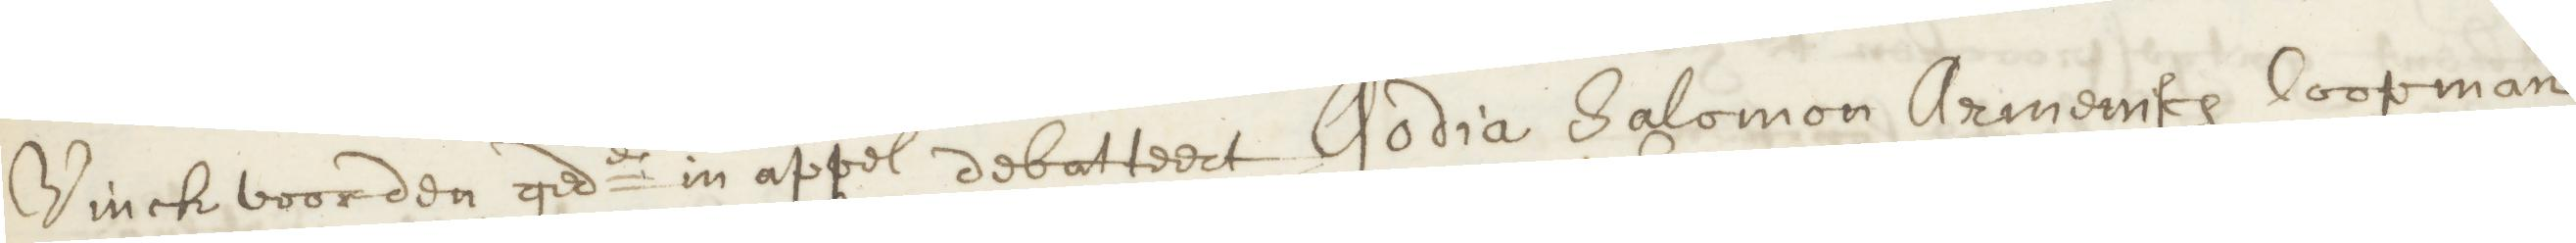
Vinck voor den ged=e in appel debatteert Godia Salomon Armensch Coopman
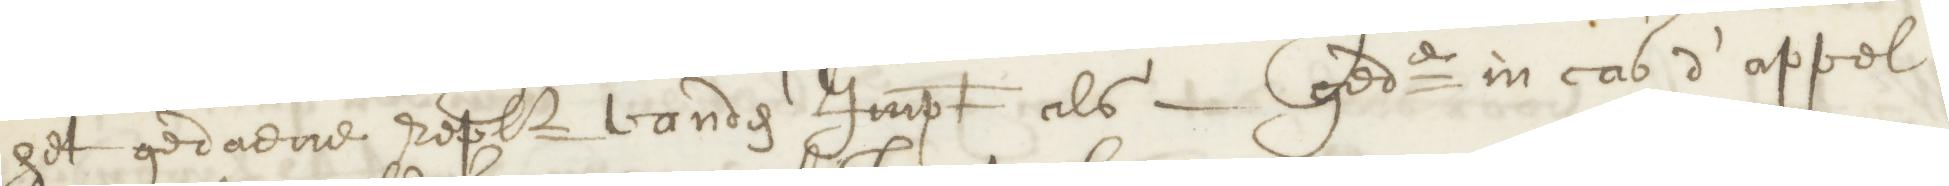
het gedaene replijk vanden Jmpt als _ ged=e in cas d’ appel
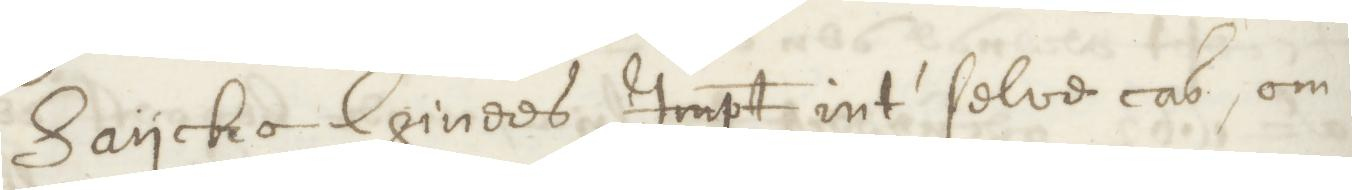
Saijcko Chinees Jmpt int' selve cas, om
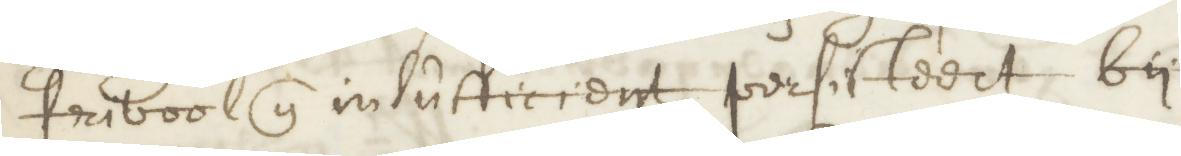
frivool ende in sufficient persisteert bij
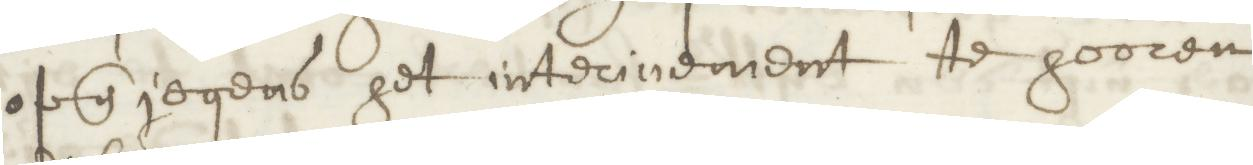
op ende jegens het interinement te hooren
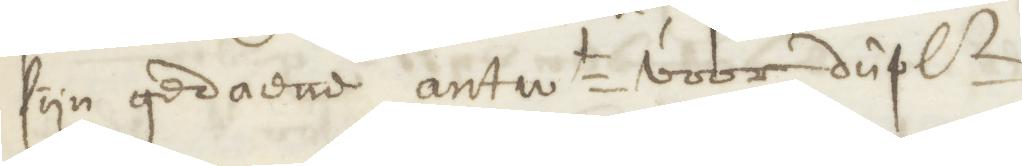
sijn gedaene antw=t voor duplijk
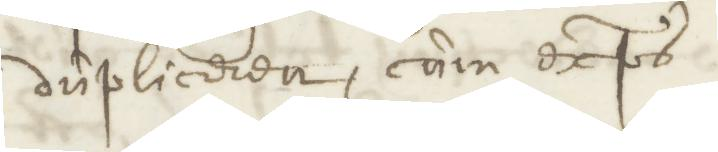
dupliceren, cum exps
